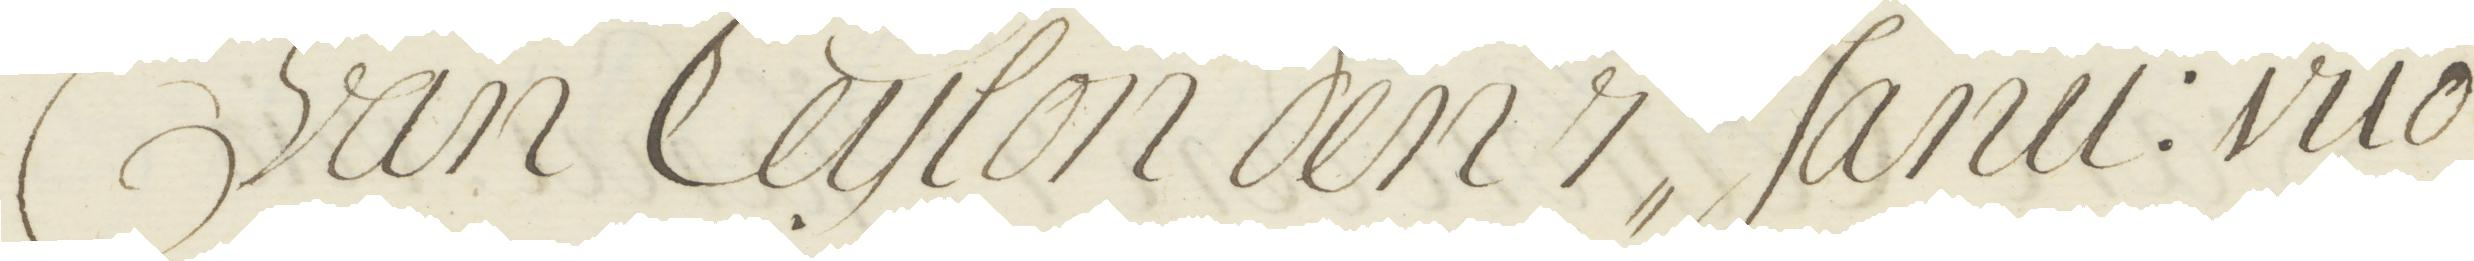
Van Ceijlon den 7„e Janu: 1710
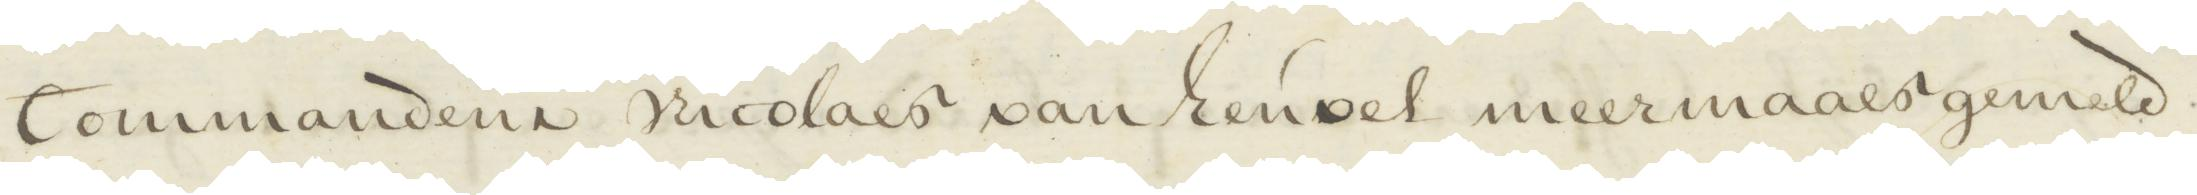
Commandeur Nicolaes van heuvel meermaals gemeld
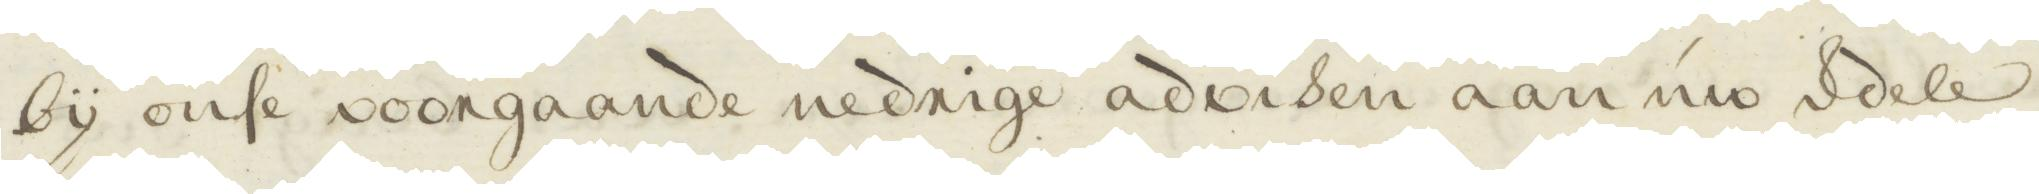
bij onse voorgaande nedrige advisen aan uw Edele
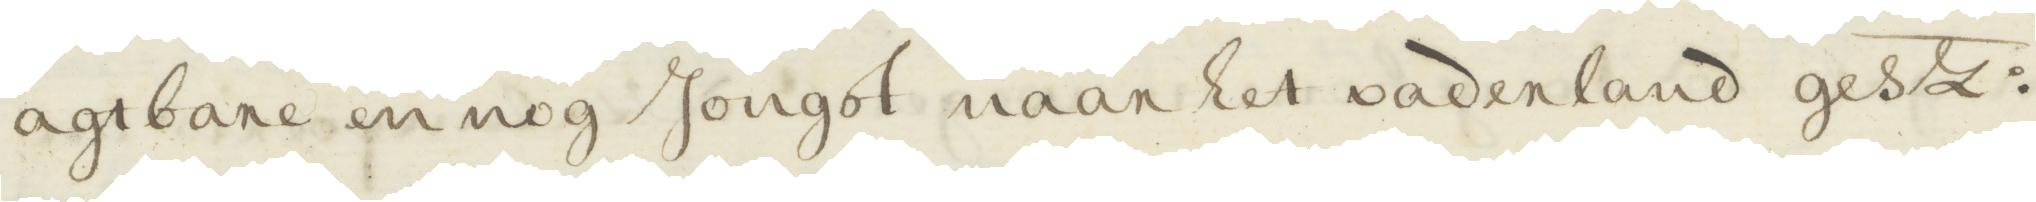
agtbare en nog Jongst naar het vaderland gesz:
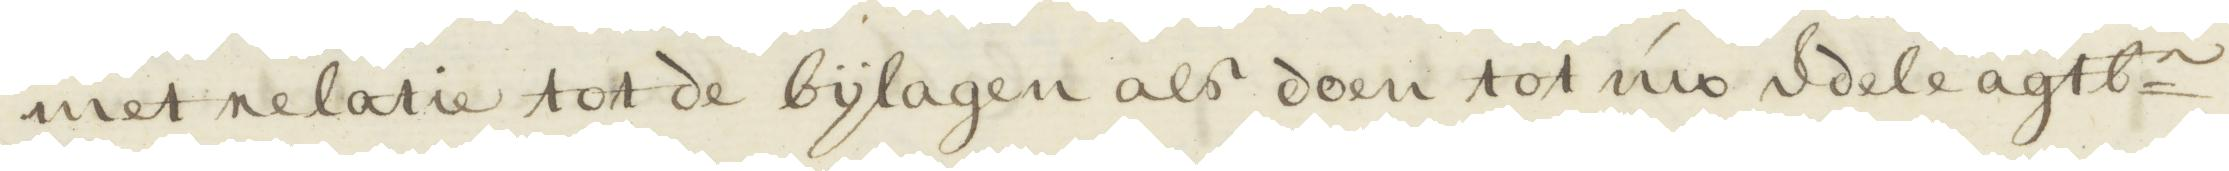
met relatie tot de bijlagen als doen tot uw Edele agtb=r
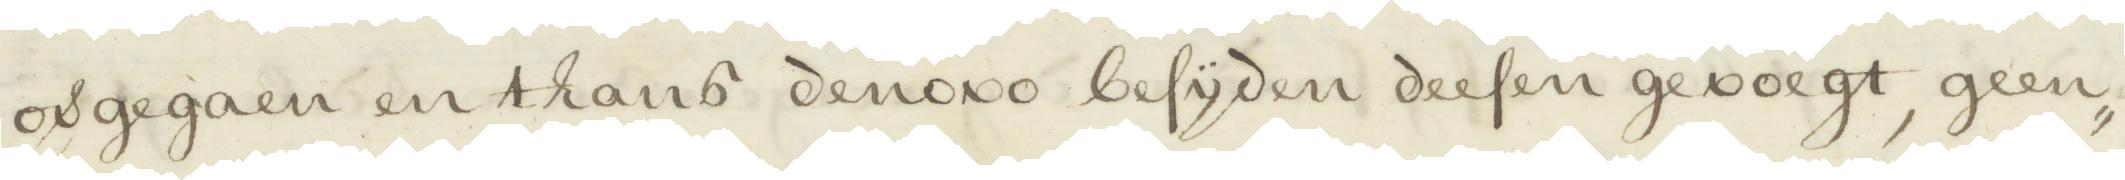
overgegaen en thans denovo besijden deesen gevoegt, geen„
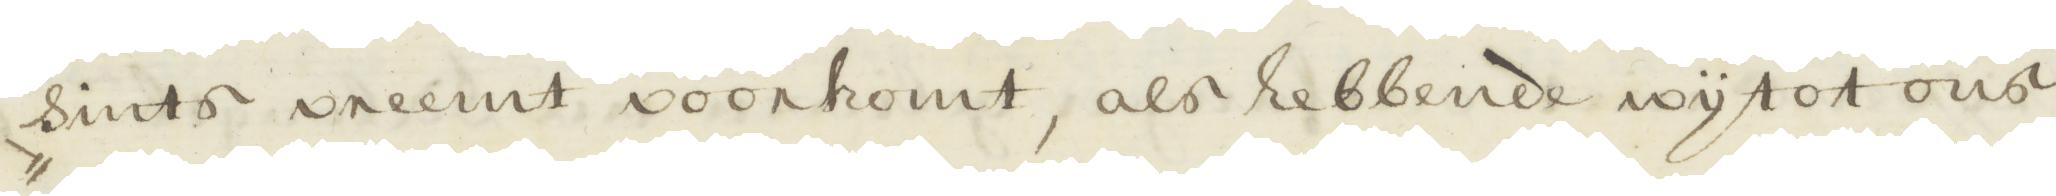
„sints vreemt voorkomt, als hebbende wij tot ons
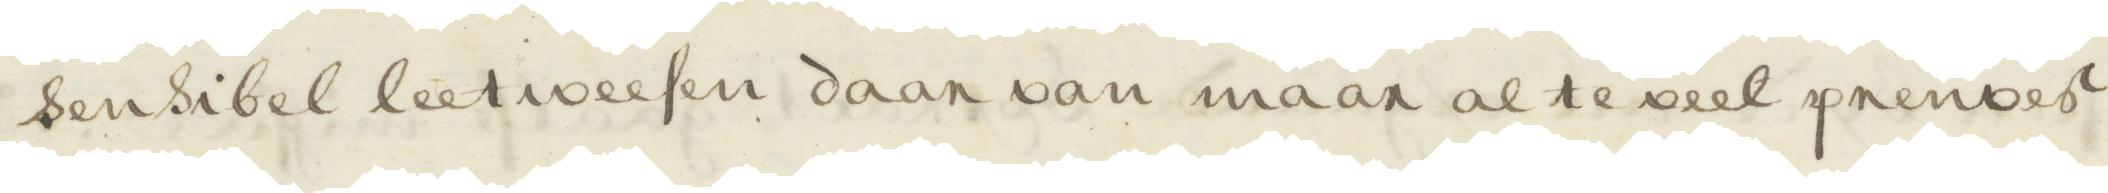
sensibel leetweesen daar van maar al te veel preuves
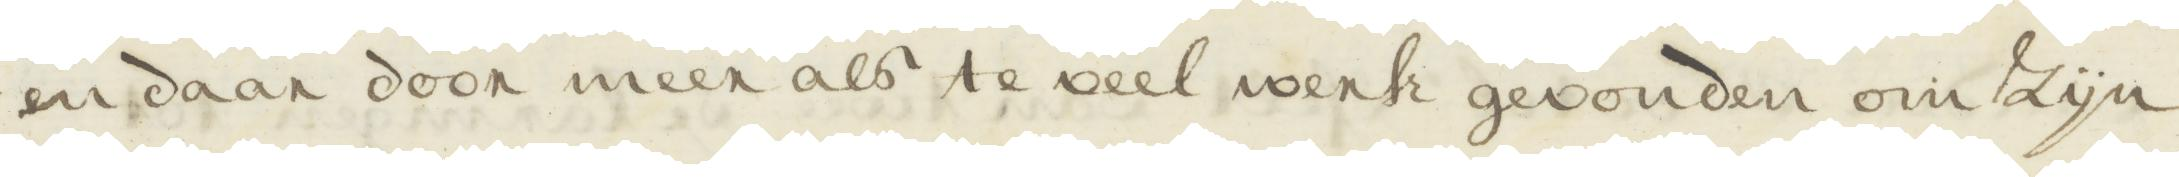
en daar door meer als te veel werk gevonden, om zijn
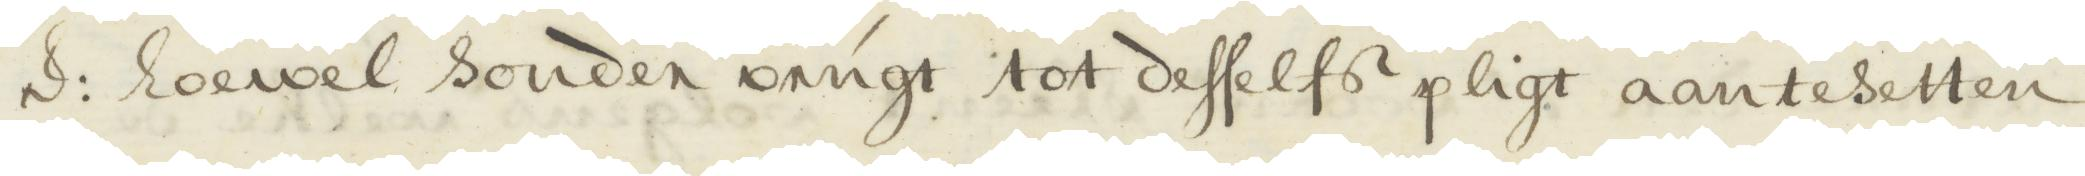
E: hoewel sonder vrugt tot desselfs pligt aan te setten
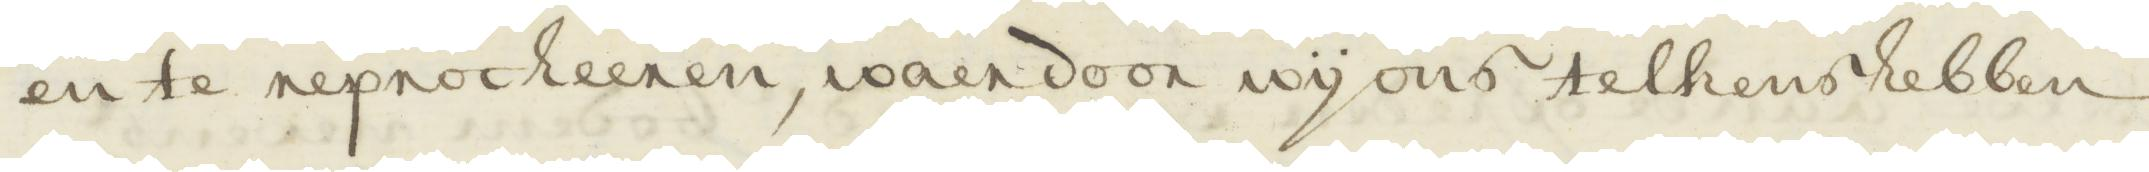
en te reprocheeren, waer door wij ons telkens hebben
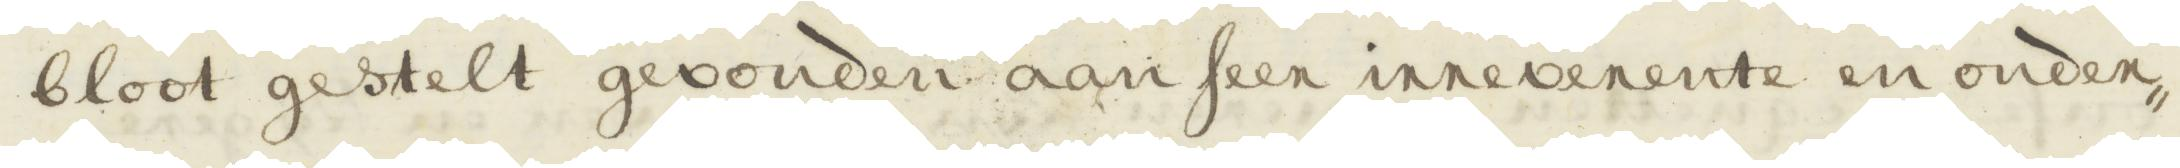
bloot gestelt gevonden aan seer irreverente en onder„
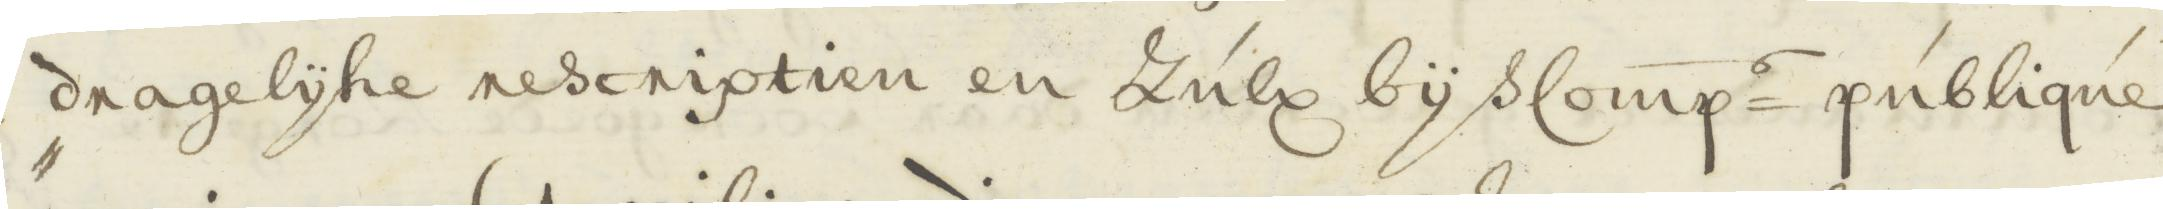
„dragelijke rescriptien en zulx bij sComp=s publique
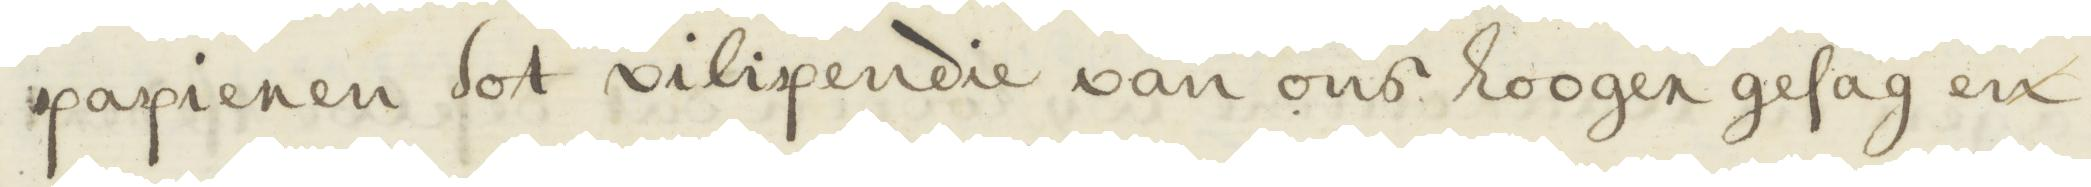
papieren tot vilipendie van ons hooger gesag en
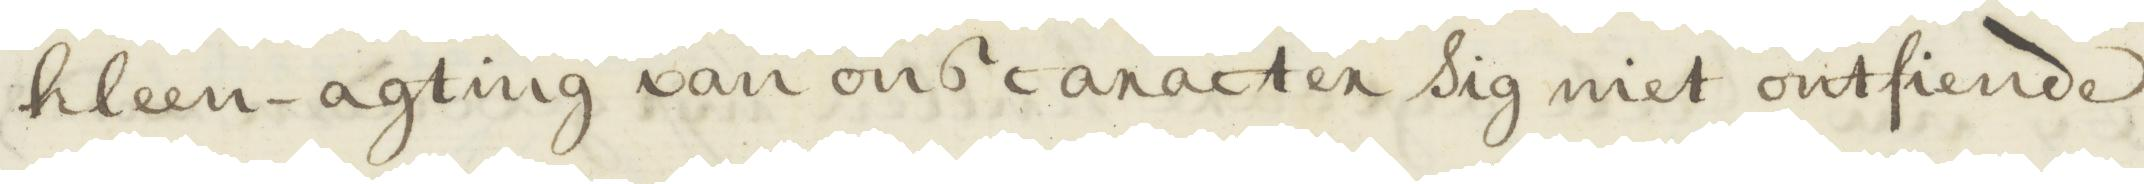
kleen-agting van ons caracter sig niet ontsiende
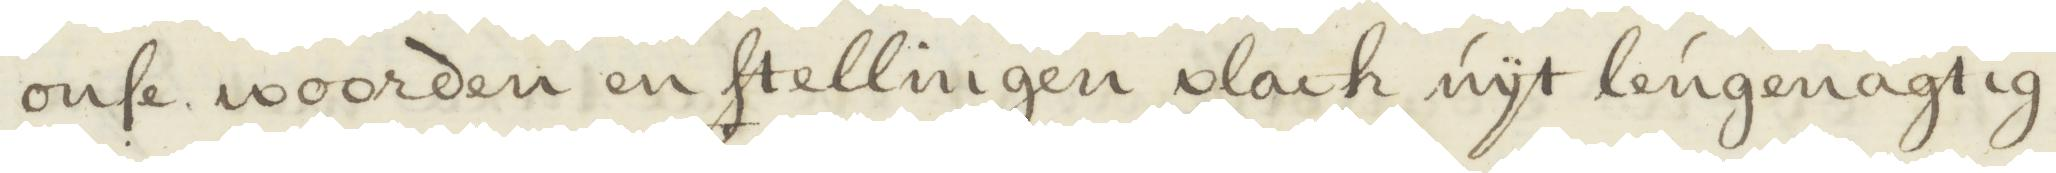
onse woorden en stellingen vlack uijt leugenagtig
